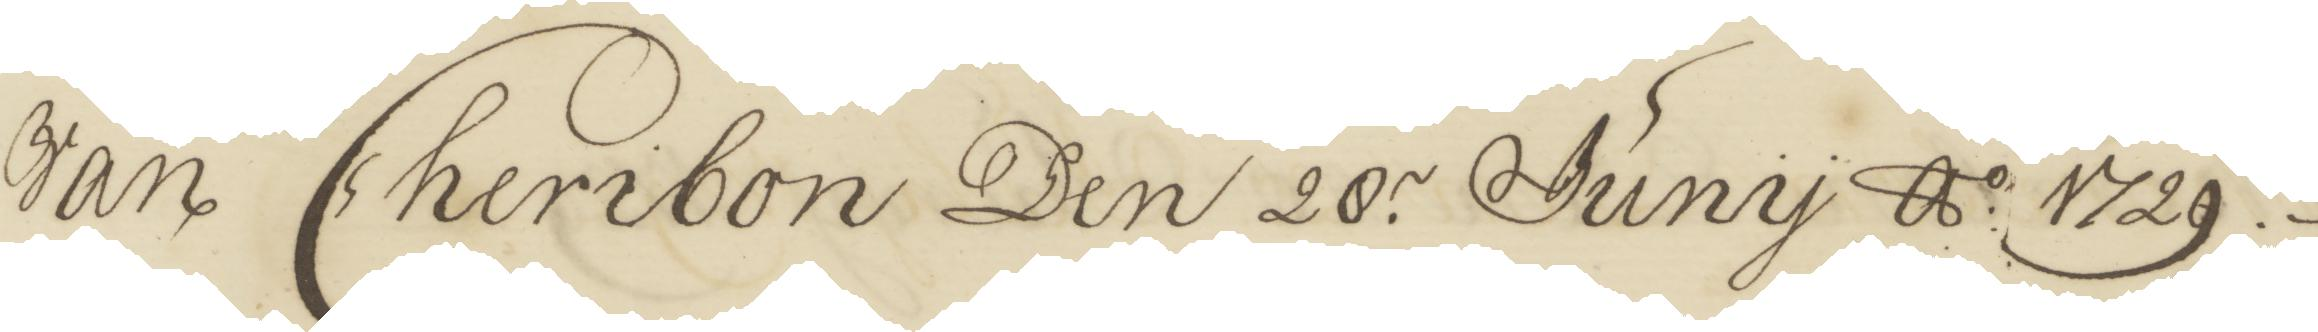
Van Cheribon Den 28:e Iunij A:o 1729. —
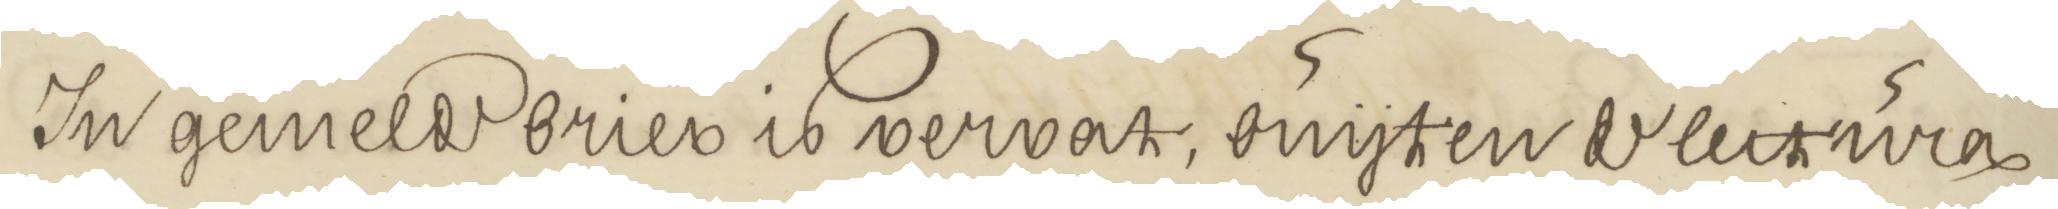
In gemelde briev is vervat; buijten de lectura
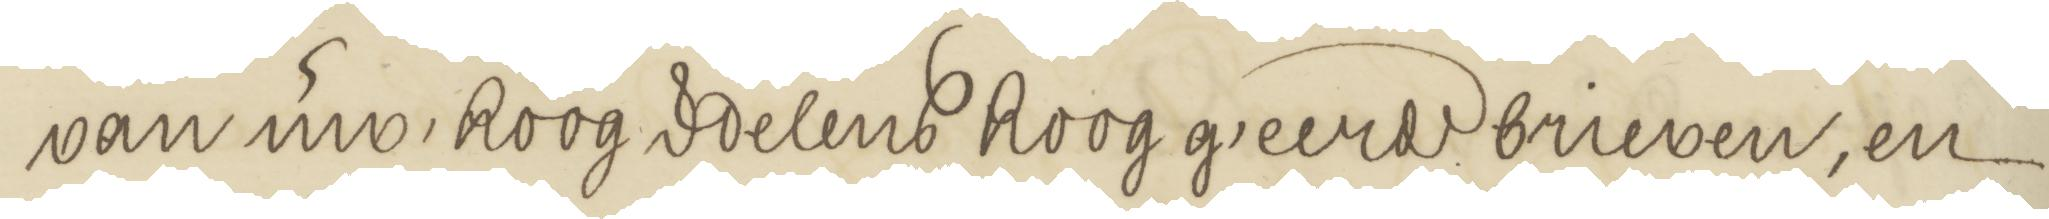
van uw' hoog Edelens hoog g'eerde brieven, en
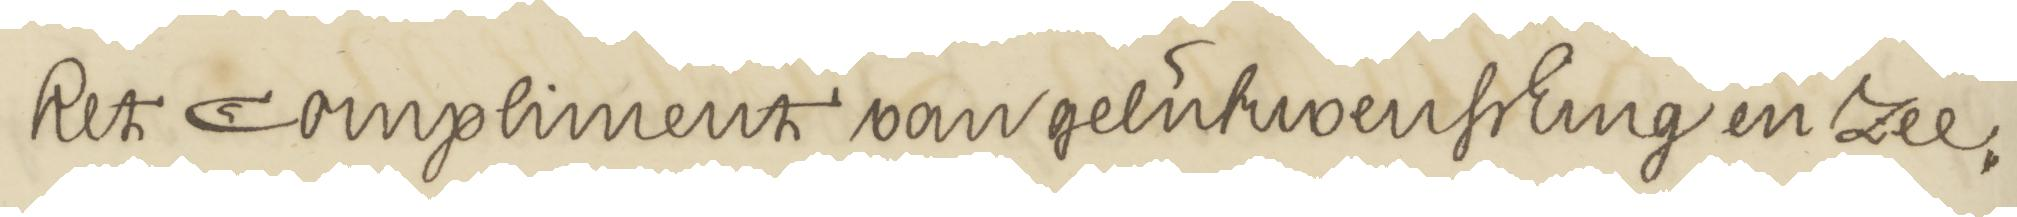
het compliment van gelukwensching en Zee„
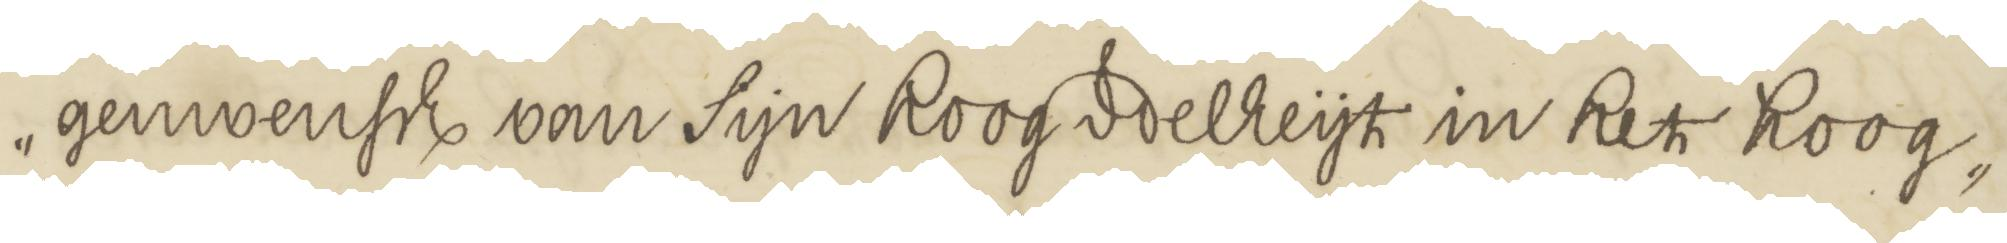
„genwensch van Sijn hoog Edelheijt in het hoog„
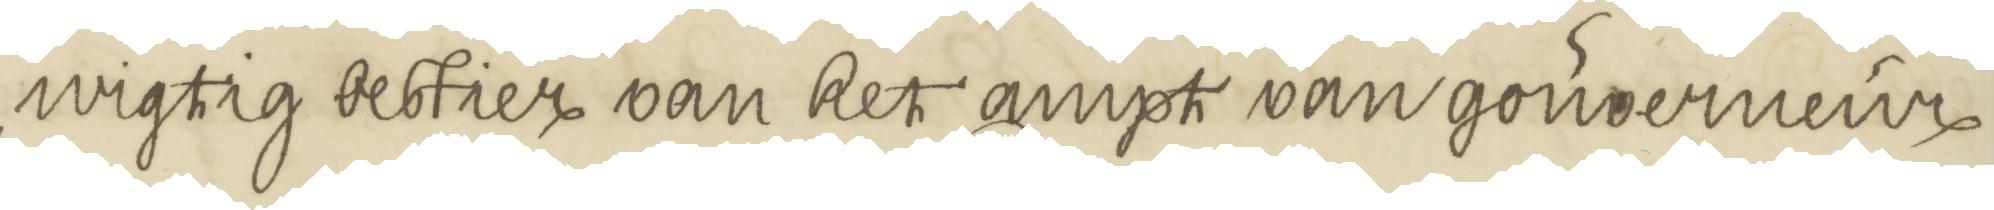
wigtig bestier van het ampt van gouverneur
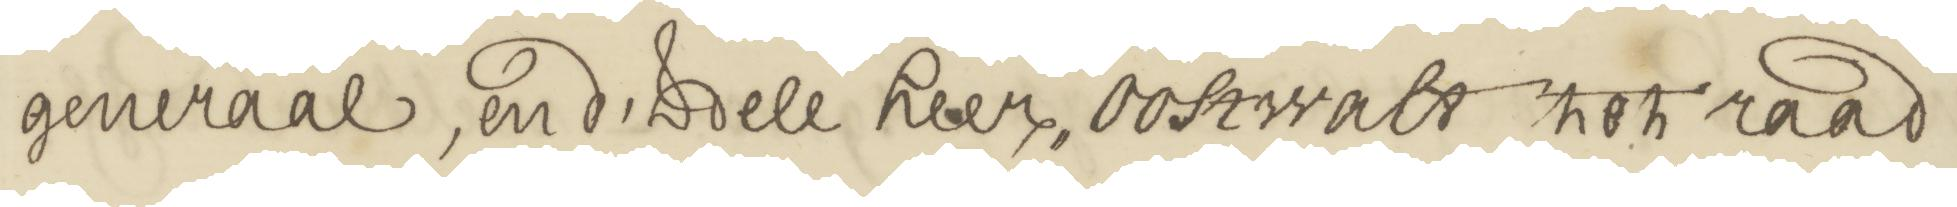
generaal, en d' Edele heer „ oostwalt tot raad
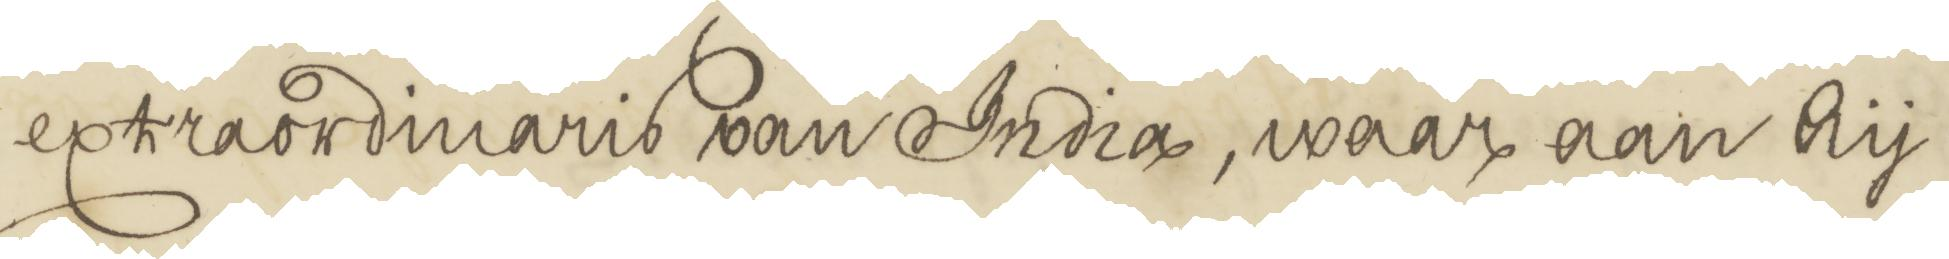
extraordinaris van India, waar aan hij
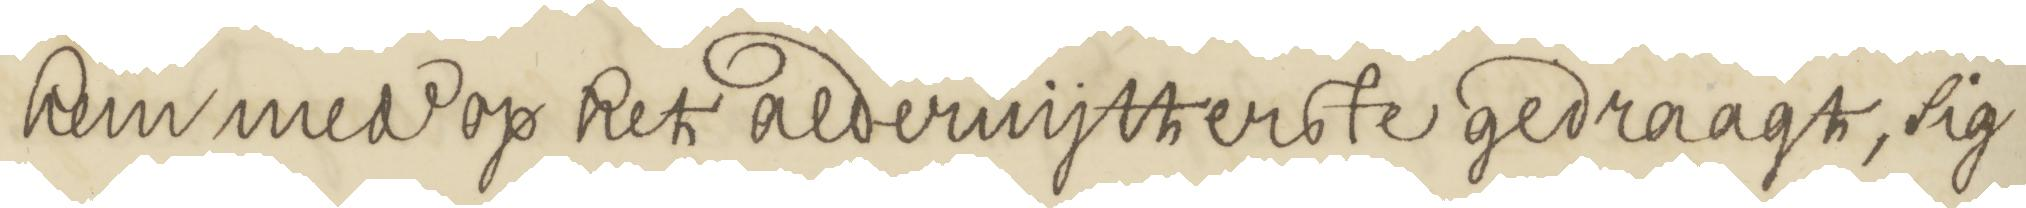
hem mede op het alderuijtterste gedraagt, sig
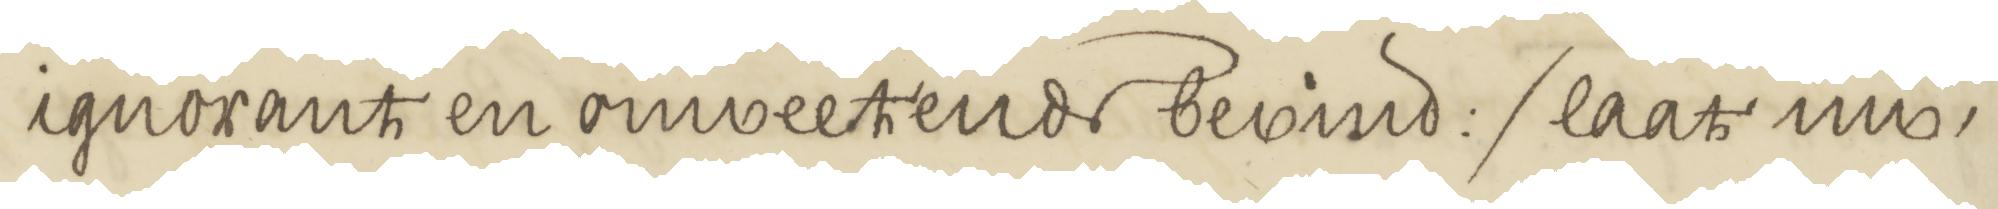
ignorant en onweetende bevind: / laat uw',
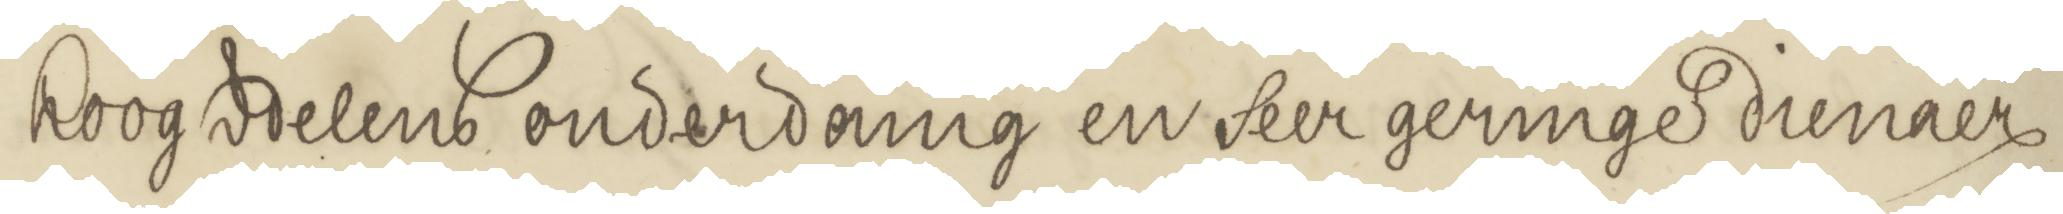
hoog Edelens onderdanig en seer geringe dienaer
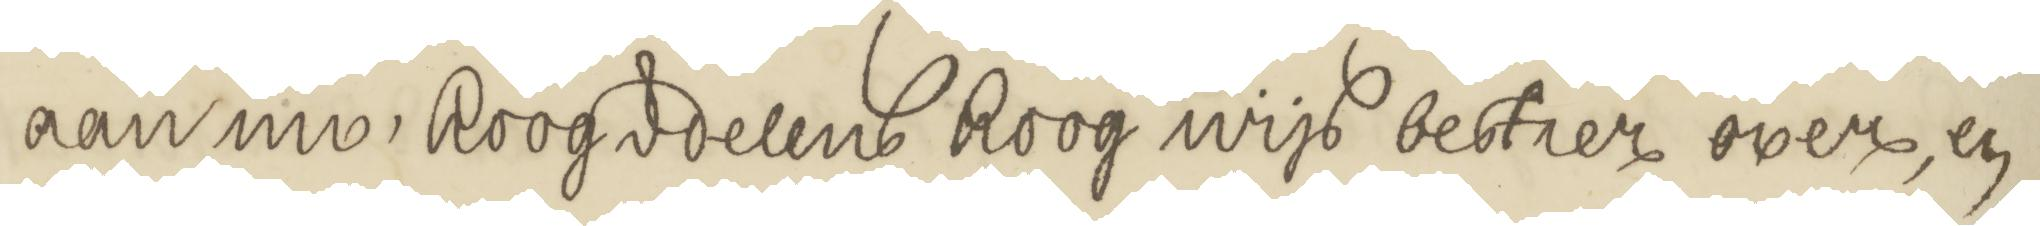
aan uw' hoog Edelens hoog wijs bestier over, en
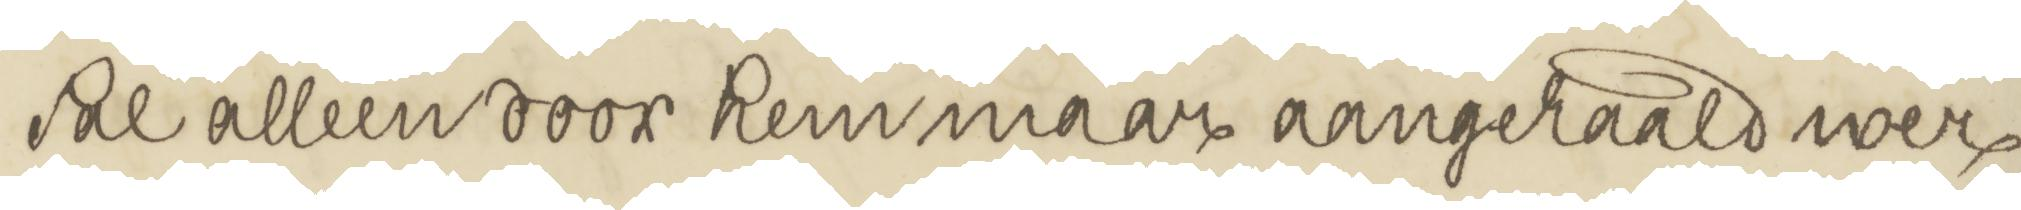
sal alleen door hem maar aangehaald wer
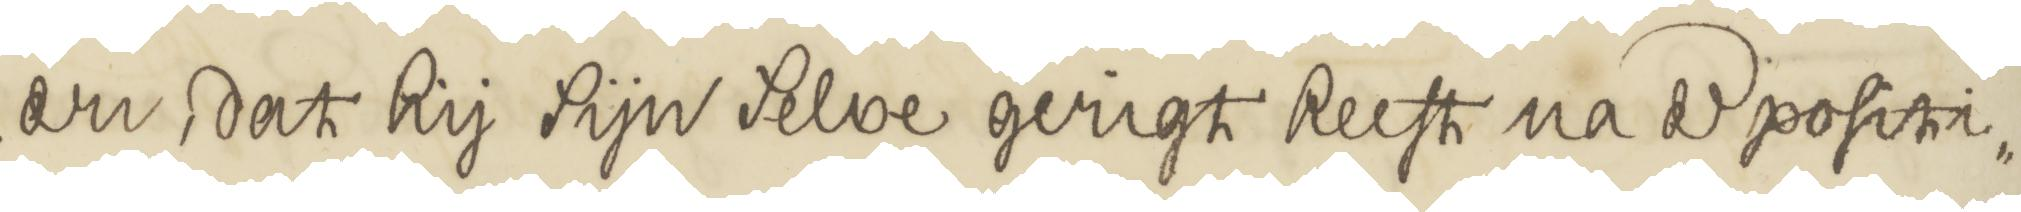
den, dat hij Sijn Selve gerigt heeft na de positi„
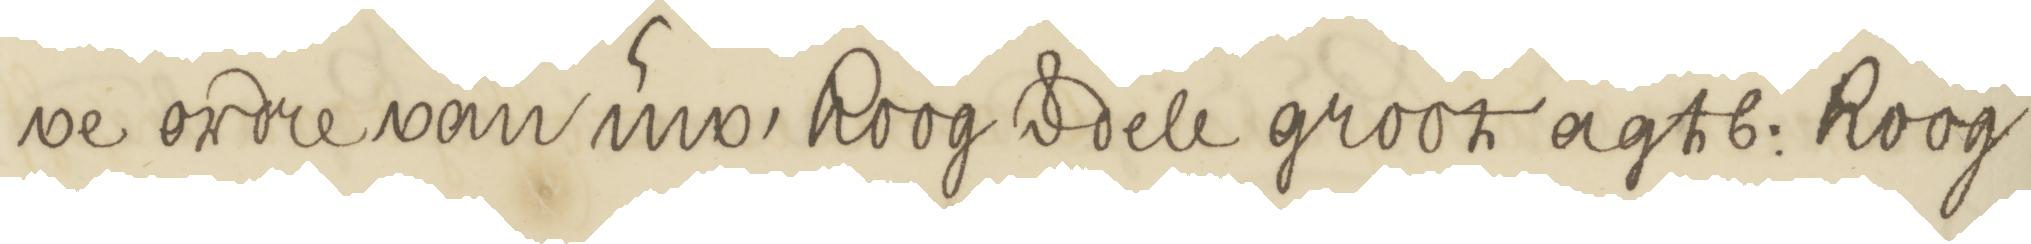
ve ordre van uw' hoog Edele groot agtb: hoog
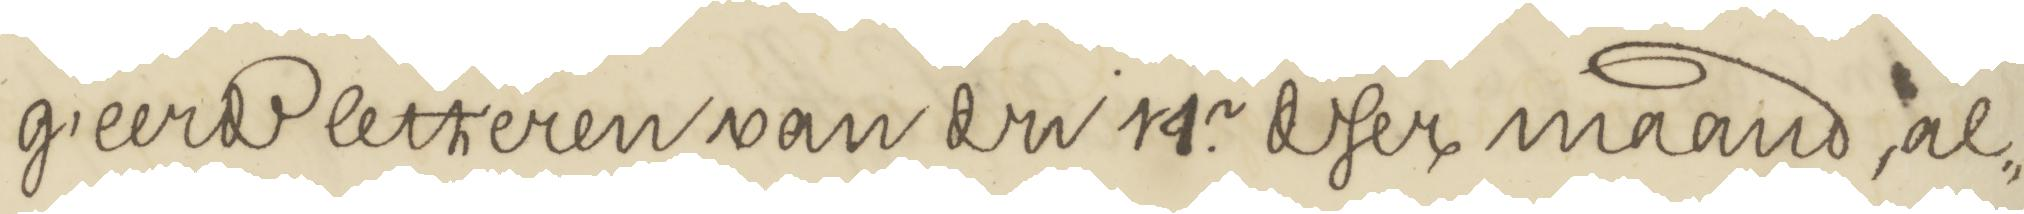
g'eerde letteren van den 14.e deser maand, al„
